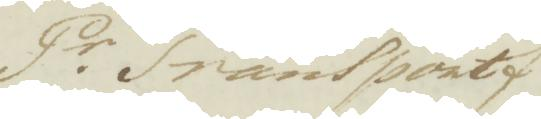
P„r Transport ƒ
